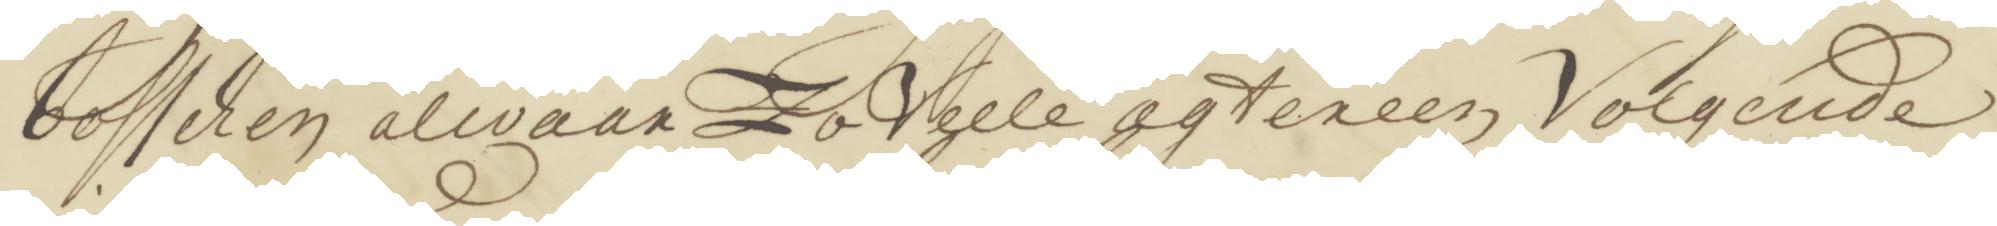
bosschen alwaar Zo veele agtereen Volgende
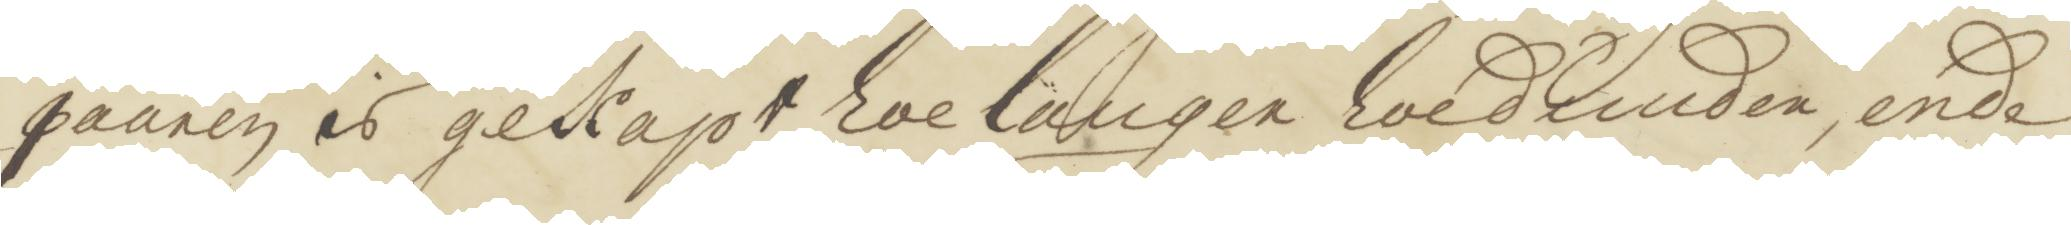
jaaren is gekapt hoe langer hoe dunder, en de
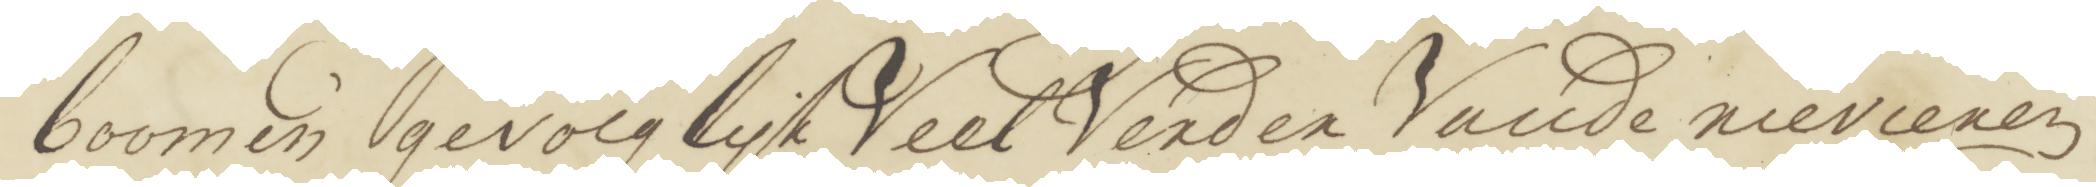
boomen gevoeglijk Veel Verder Vande rievieren
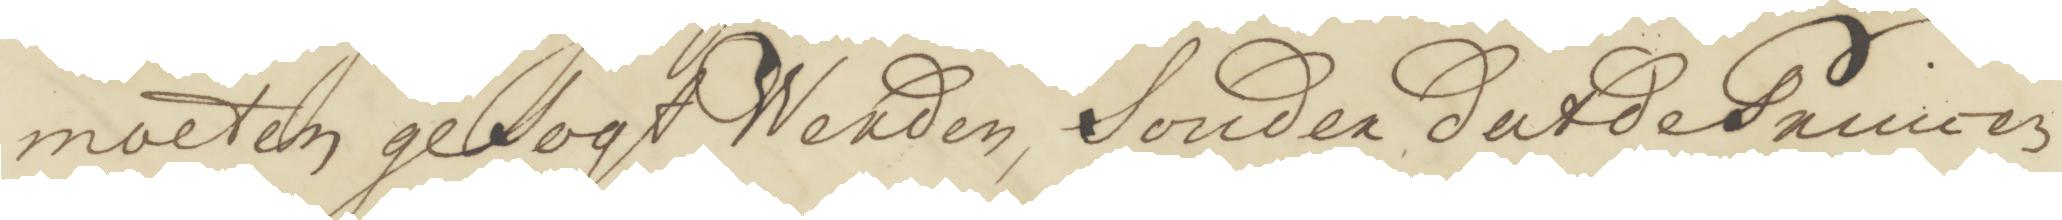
moeten gesogt Werden, Sonder dat de Princen
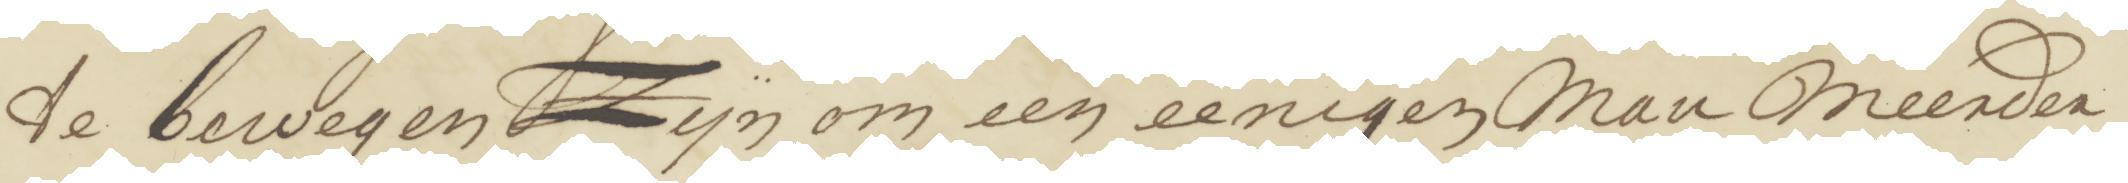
te bewegen Zijn om een eenigen man meerder
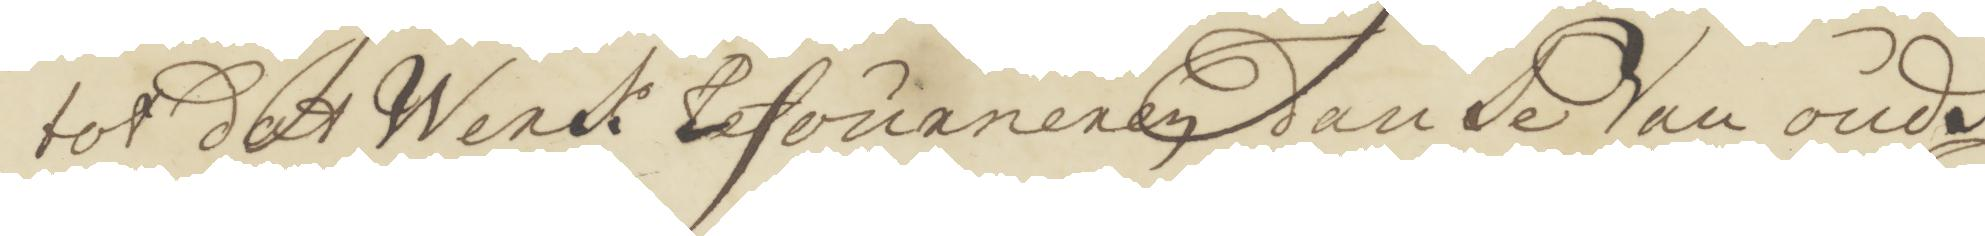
tot dat Werk te fourneren dan se Van ouds
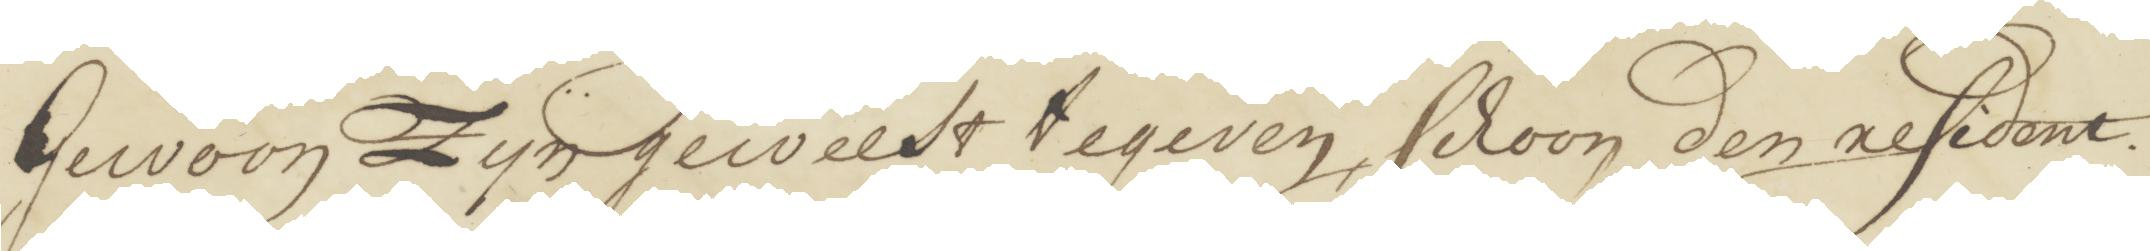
Gewoon Zijn geweest te geven, schoon den resident.
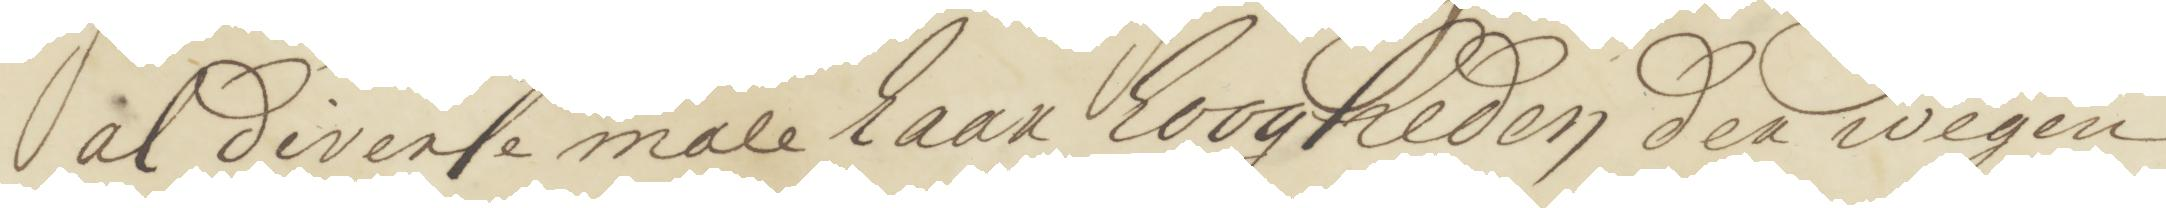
al diverse male haar hoogheden der wegen
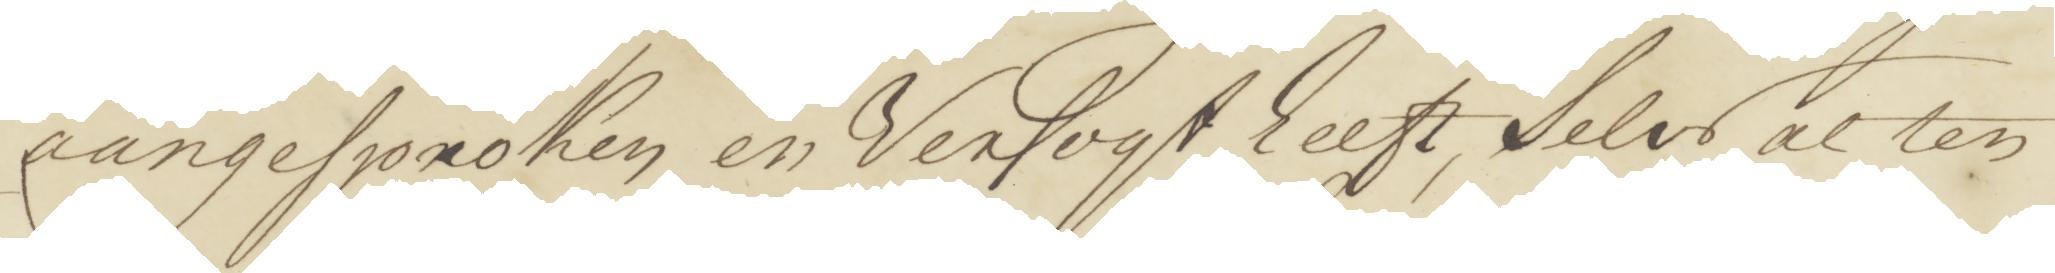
aangesproken en Versogt heeft, selvs al ten
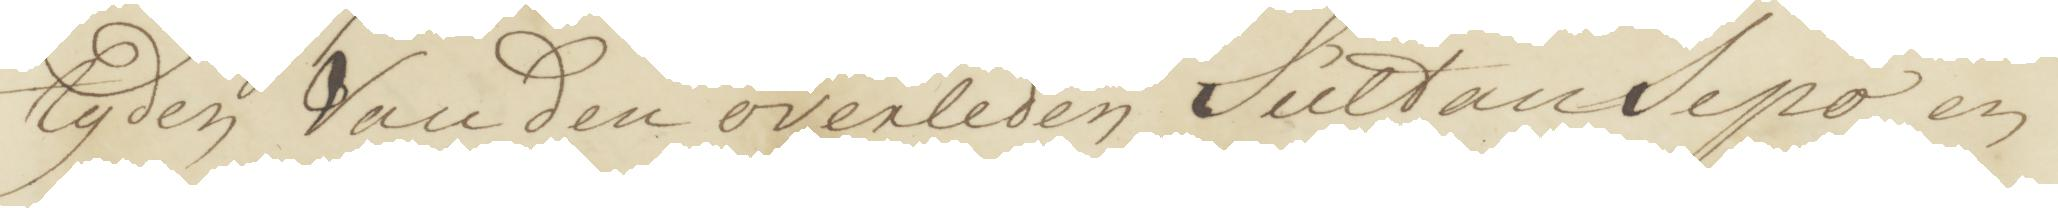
tyden Van den overleden Sultan Sepo en
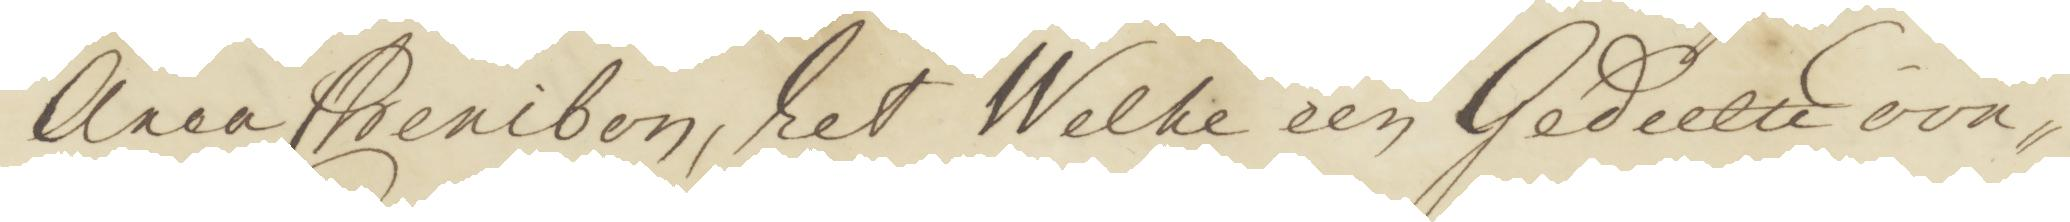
Area Cheribon, het Welke een Gedeelte oor„
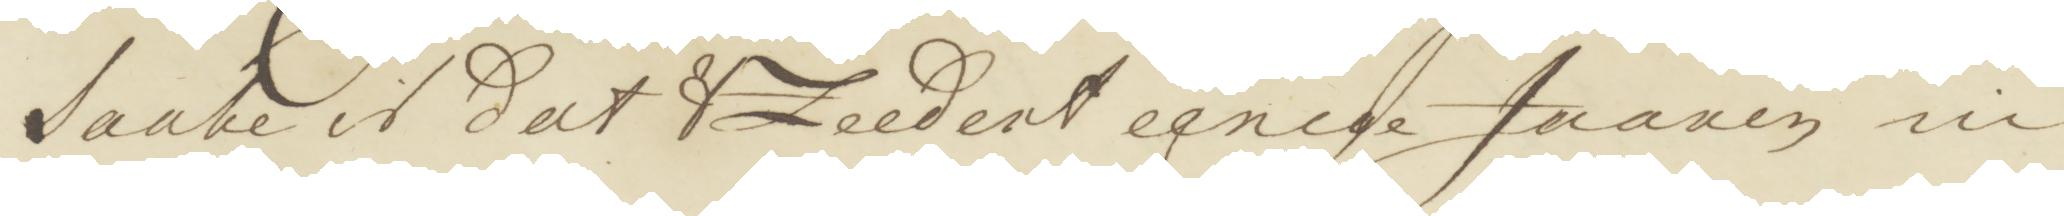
Saake is dat 't Zeedert eenige Jaaren in
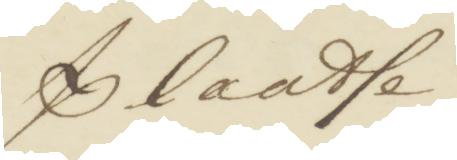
plaatse
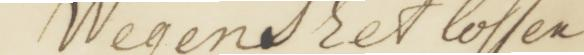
Wegens het losser
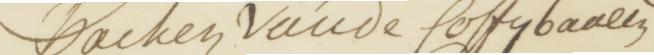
packen vande Coffijbaalen
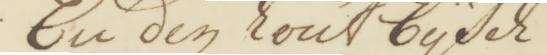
En den hout Eijsch
